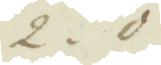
2: d
